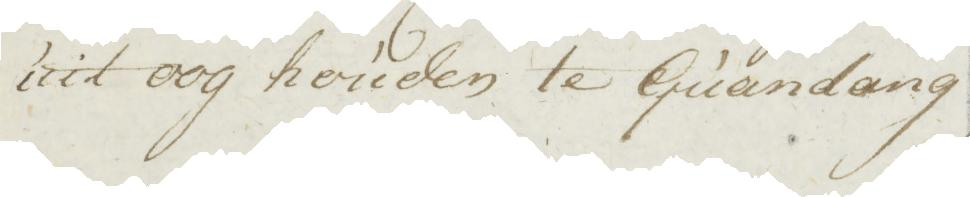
uit oog houden te Quandang
